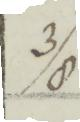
3/8
